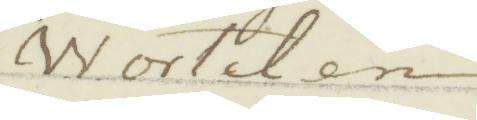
Wortelen
